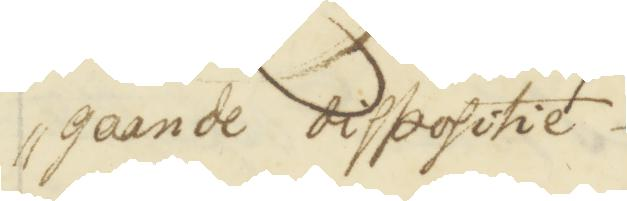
„gaande dispositie
